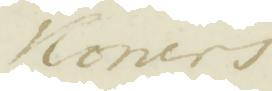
Kopers.
